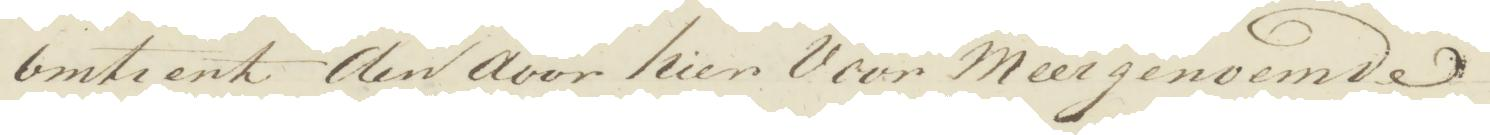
omtrent ten door hier voor meergenoemde
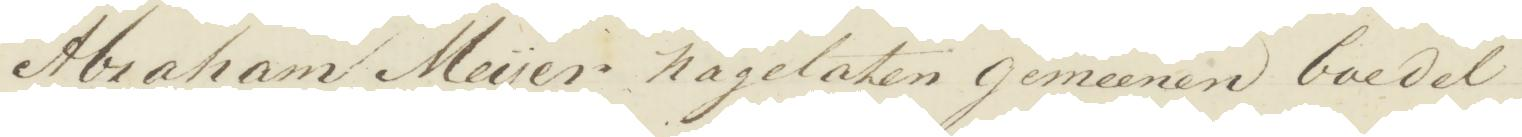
Abraham Meijer nagelaten gemeenen boedel
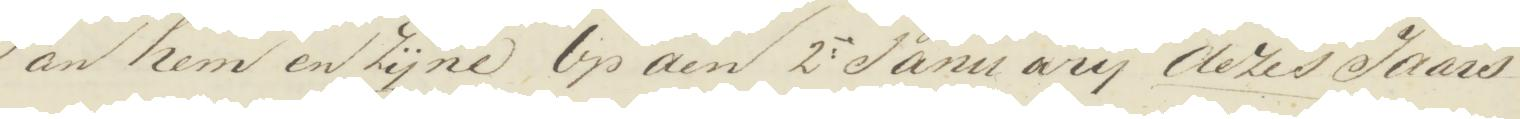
van hem en zijne op den 2:' Januarij dezes Jaars
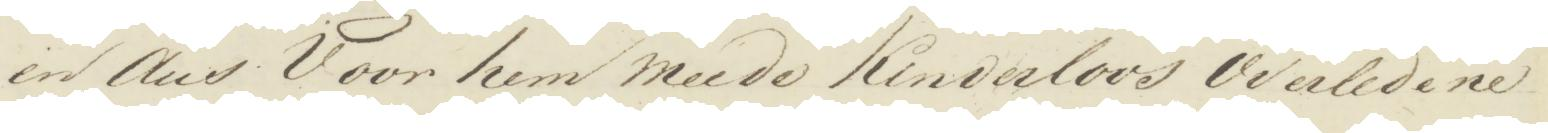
en dus voor hem meede Kinderloos overledene
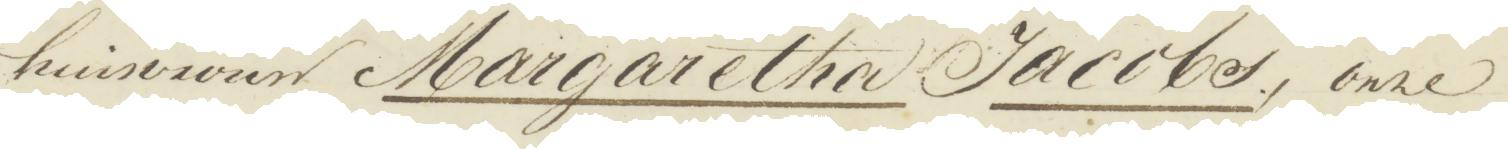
huisvrouw Margaretha Jacobs., onze
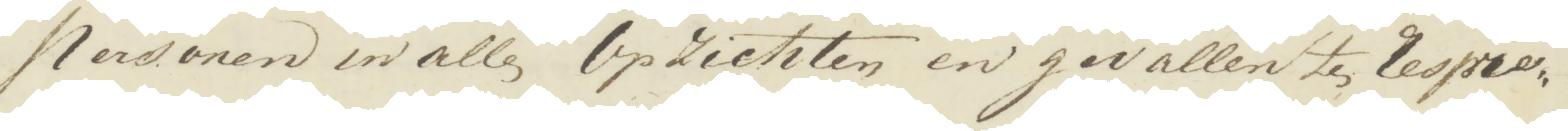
personen in allen opzichten en gevallen te repre„
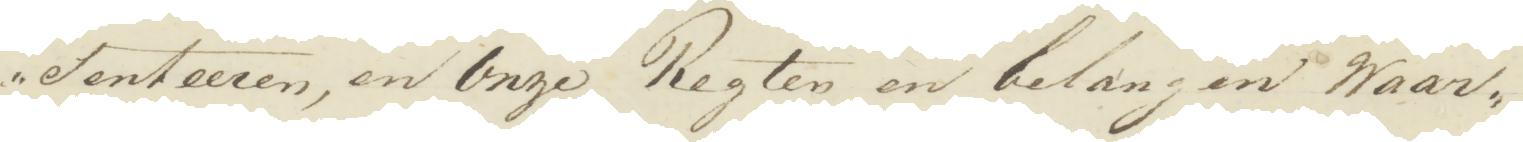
„senteeren, en onze Regten en belangen waar„
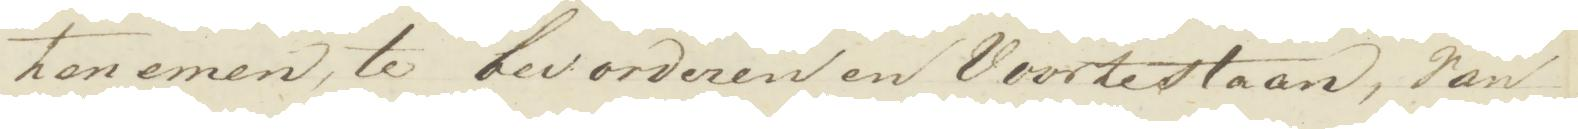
tenemen, te bevorderen en voortestaan, van
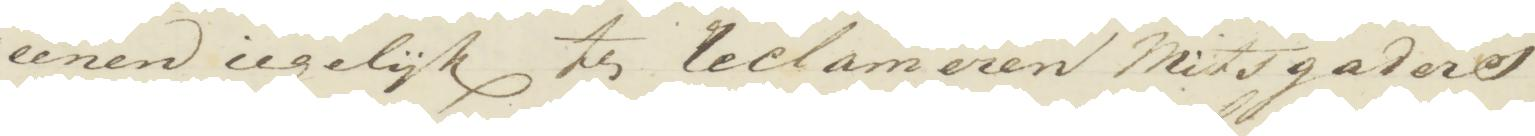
eenen iegelijk te reclameren mitsgaders
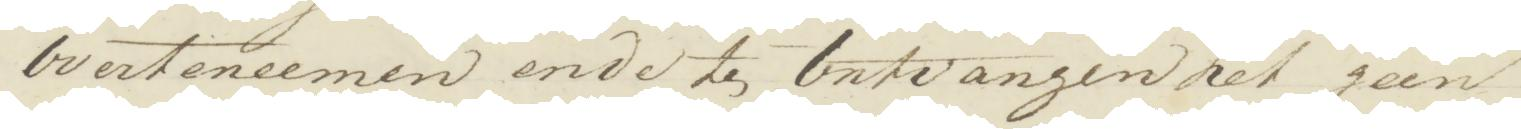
overteneemen ende te ontvangen het geen
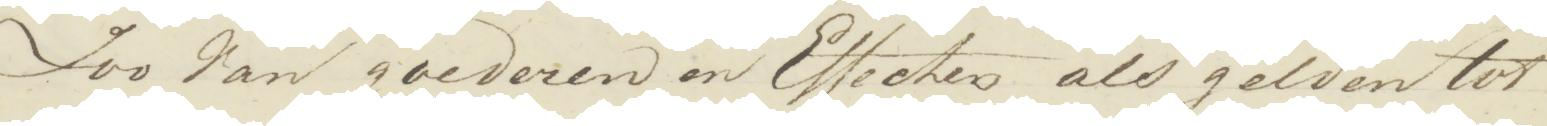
zoo van goederen en Effecten als zelven tot
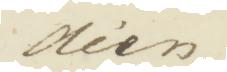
dien,
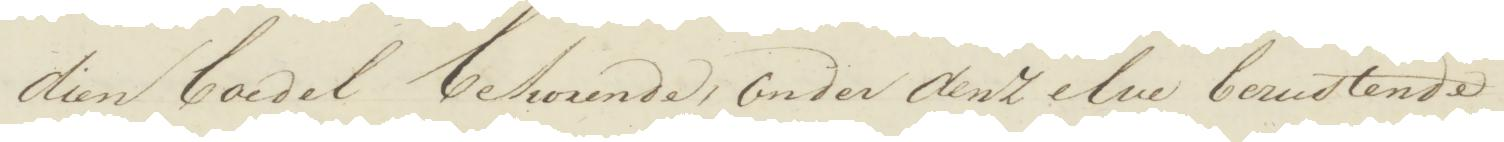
dien boedel behorende, onder denzelve berustende
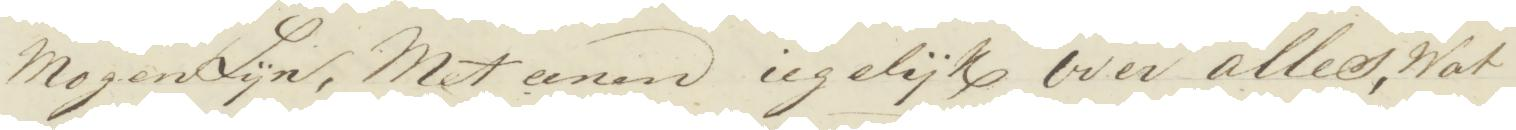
mogen zijn, met eenen iegelijk over alles, wat
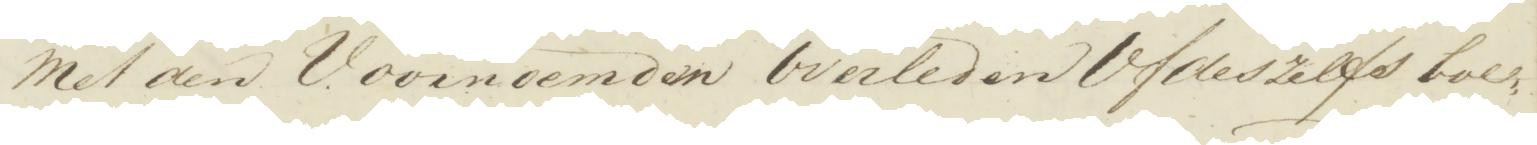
met den voornoemden overleden of deszelfs boe„
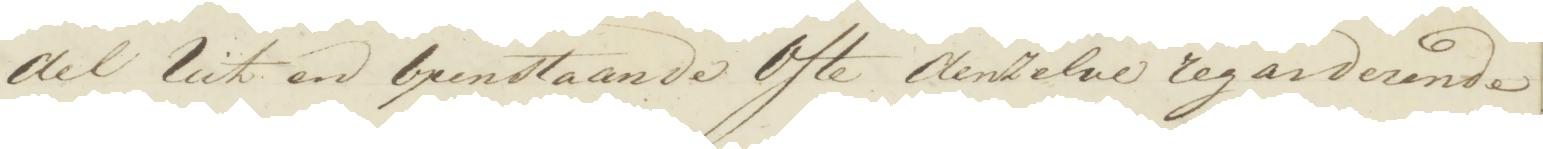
del uit en openstaande ofte denzelve regarderende
